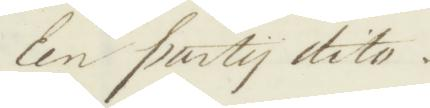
Een partij dito
